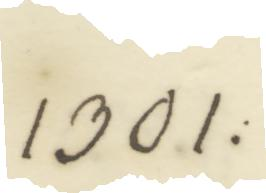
1301:
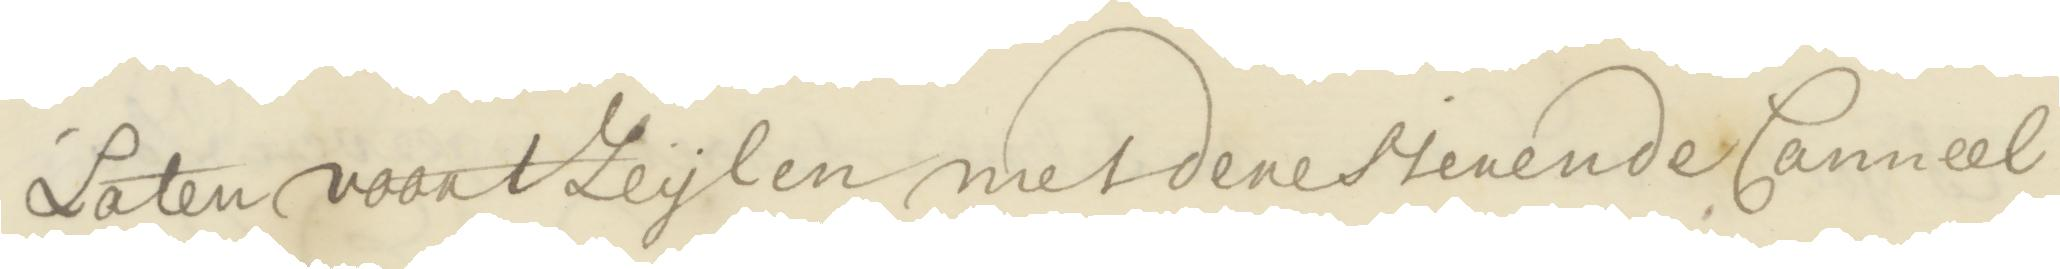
Laten voortzeijlen met deresterende Canneel
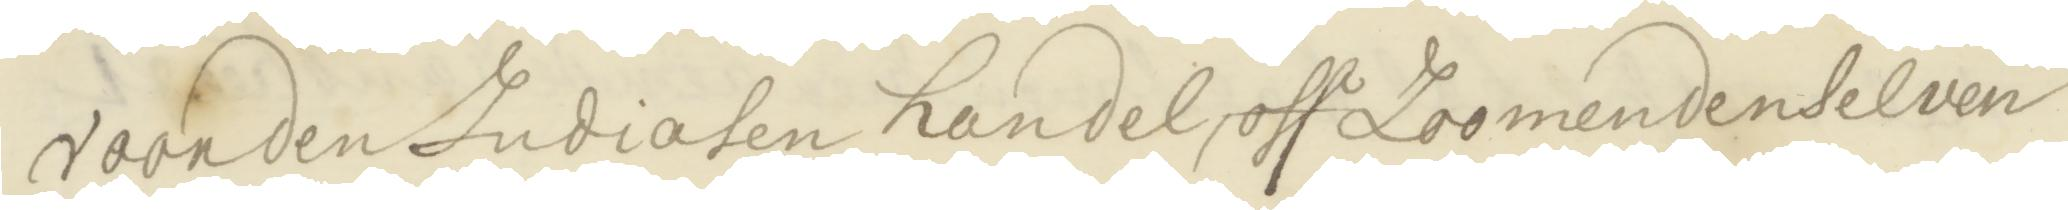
voor den Indiasen handel, off zoo men denselven
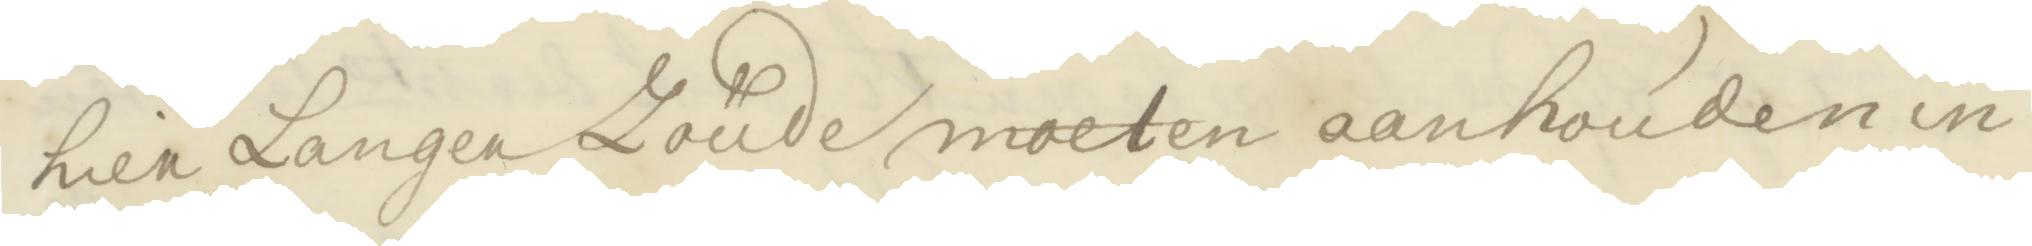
hier Langer zoude moeten aanhouden in
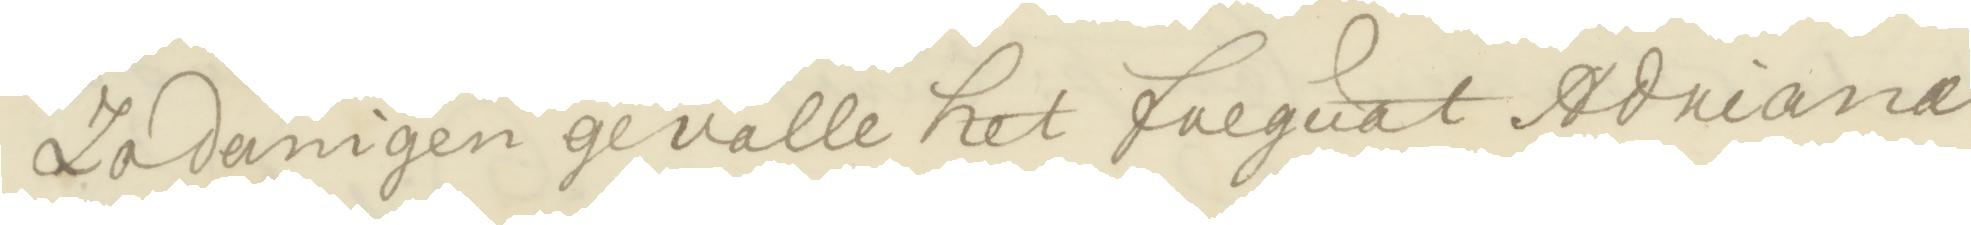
zodanigen gevalle het freguat Adriana
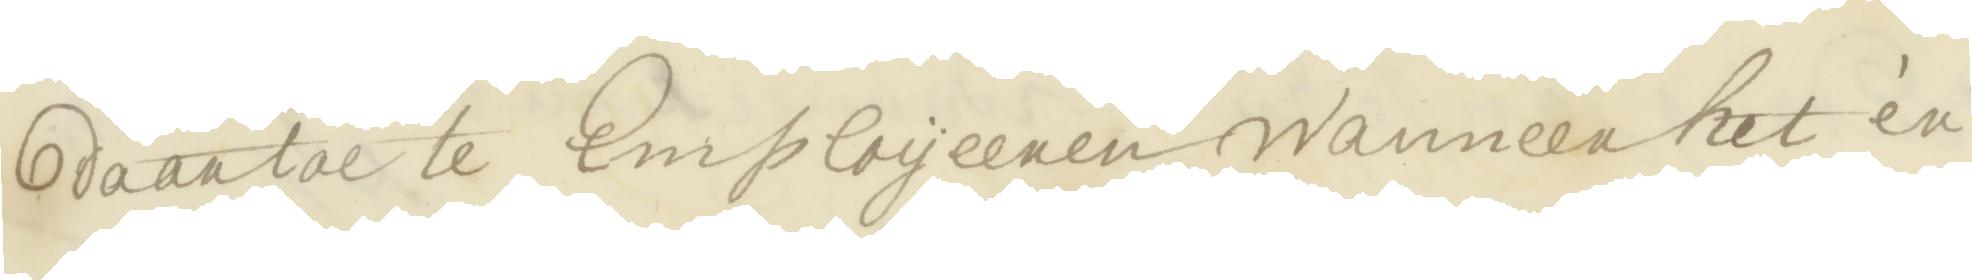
daartoe te Emploijeeren wanneer het 'er
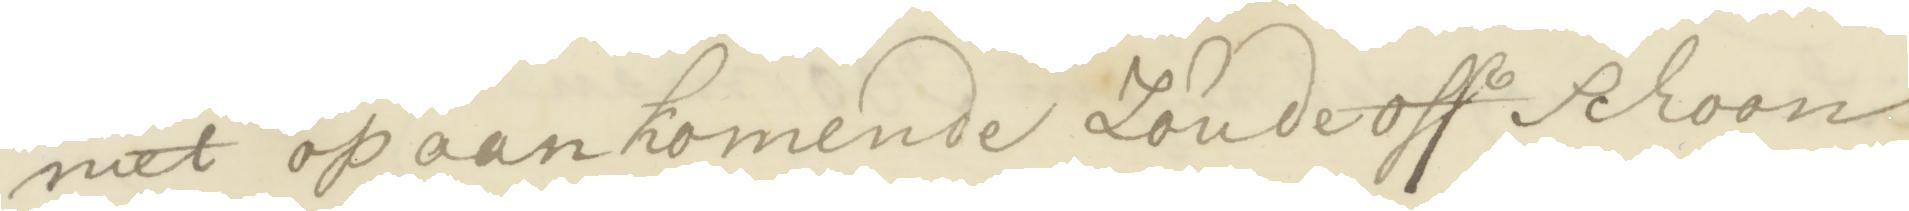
niet op aankomende zoude off schoon
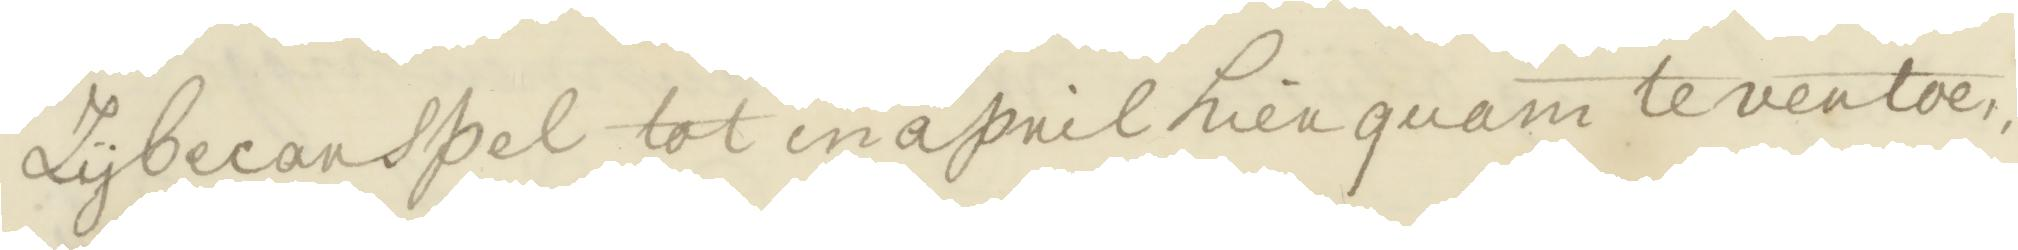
zijbecarspel tot in april hier quam te vertoe„
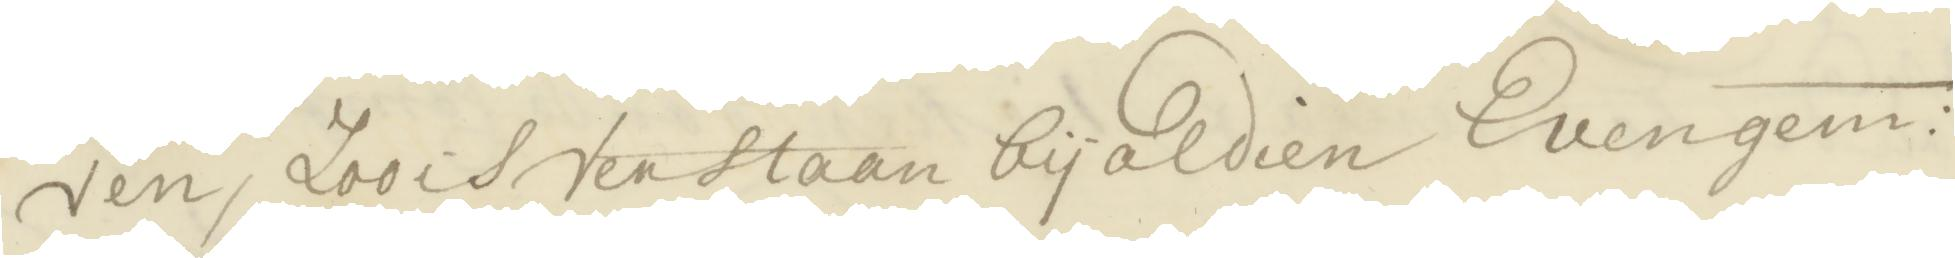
ven, zoo is verstaan bij aldien Even gem:
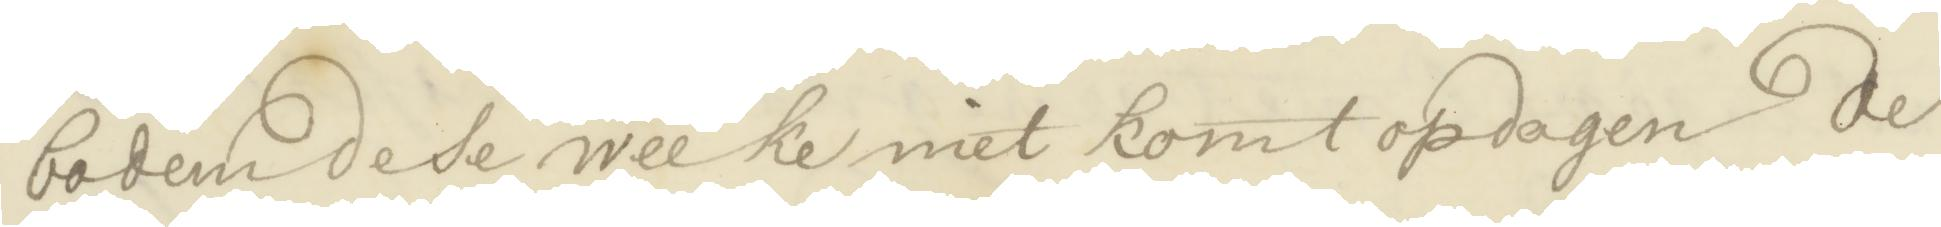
bodem dese weeke niet komt opdagen de
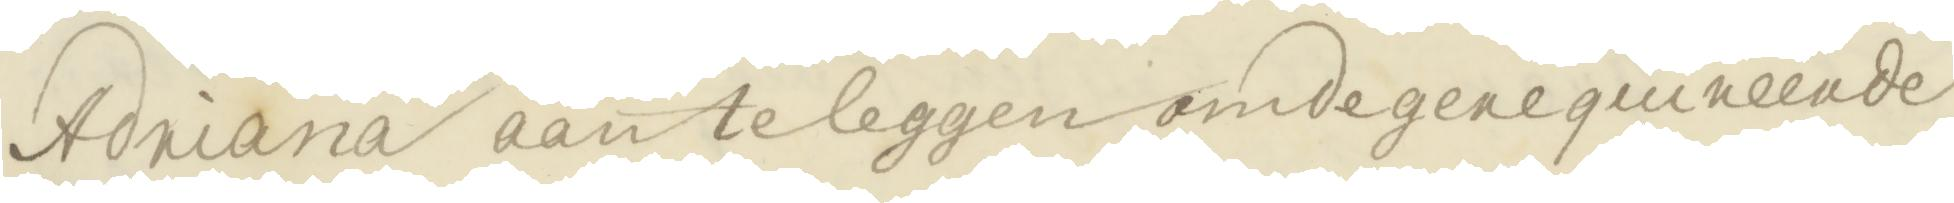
Adriana aan te leggen omde gerequireerde
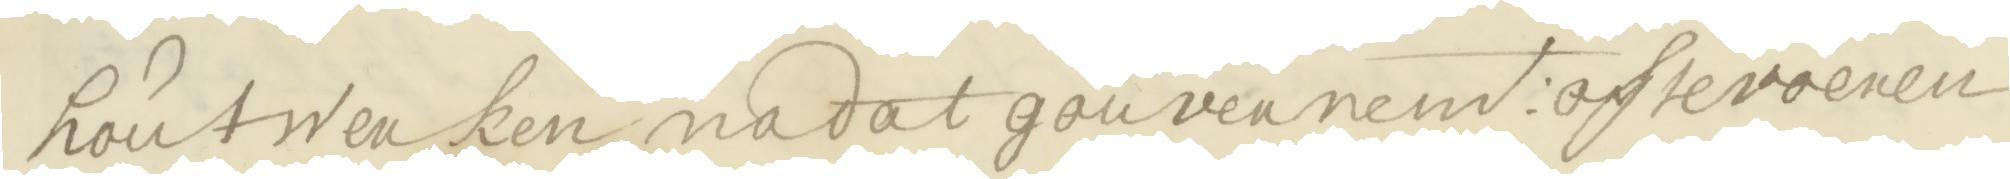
houtwerken na dat gouvernem:t over te voeren
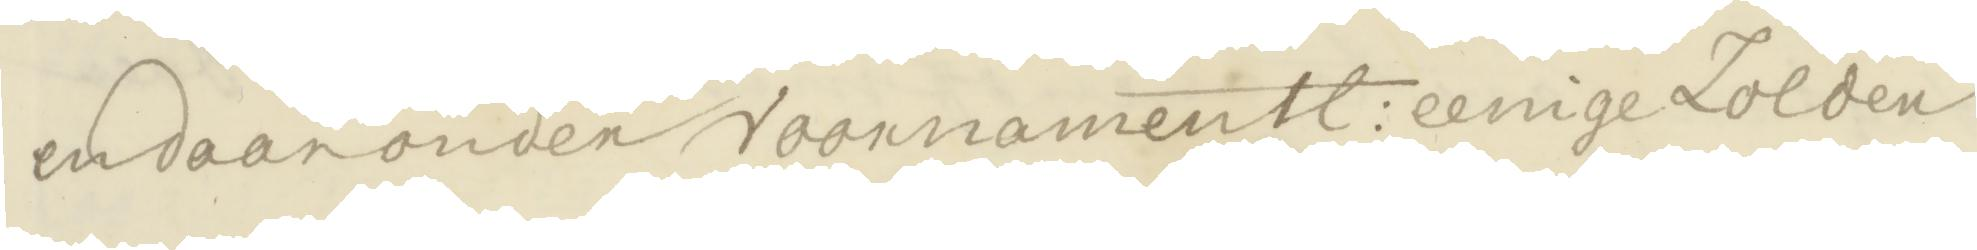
en daar onder voornamentl: eenige zolder
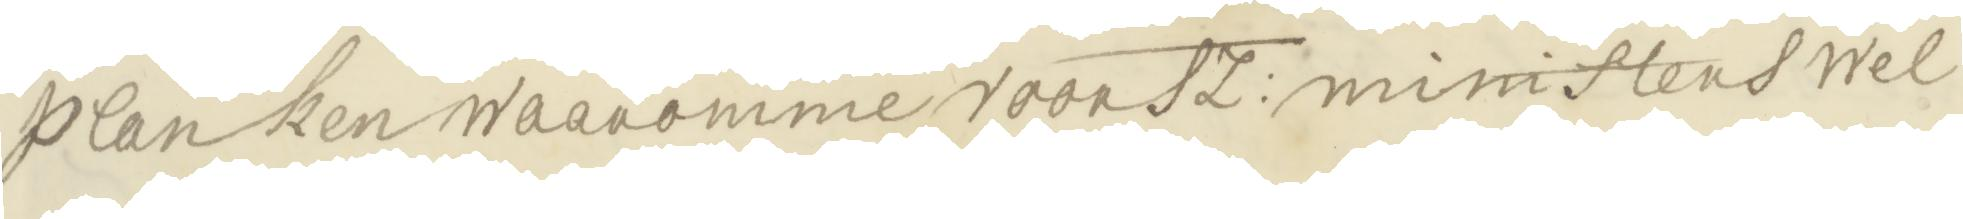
planken waar omme voorsz: ministers wel
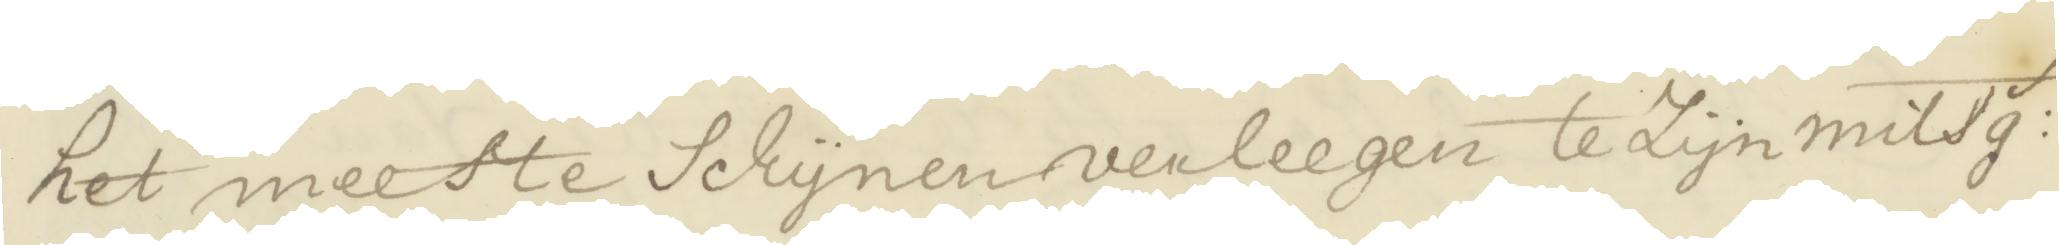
het meeste schijnen verleegen te zijn mitsg:s
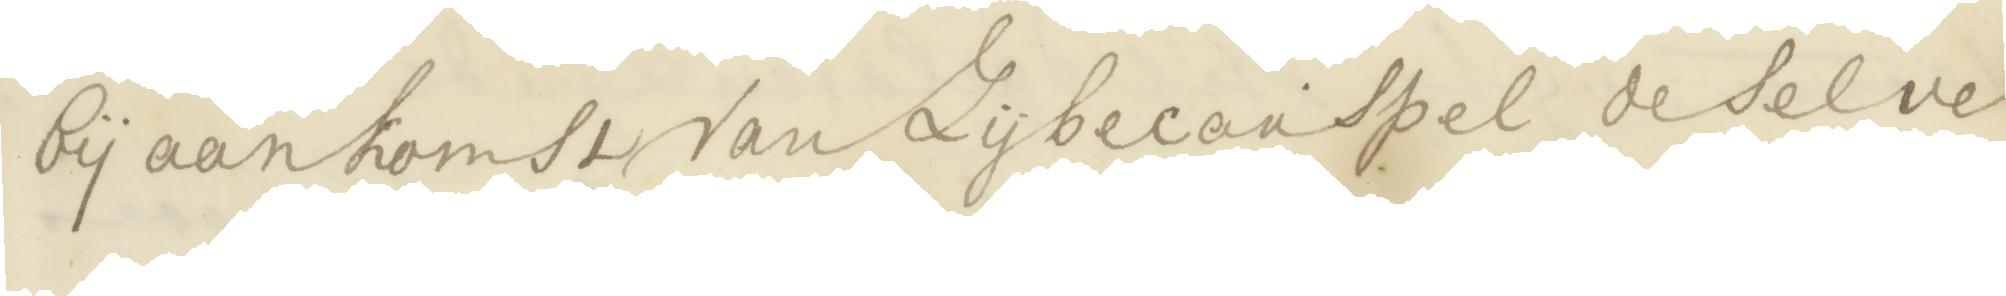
bij aankomst van zijbecarspel deselve
